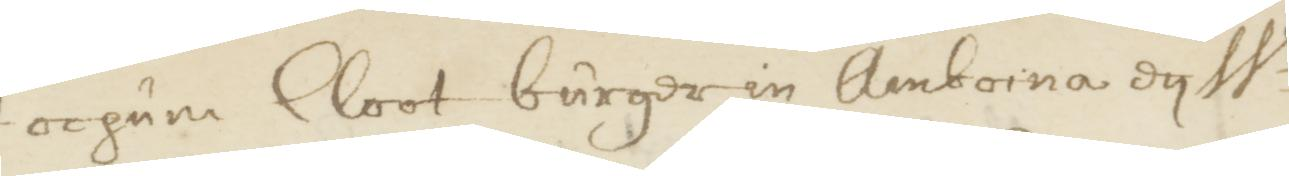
Jochum Cloot burger in Amboina eyss=r
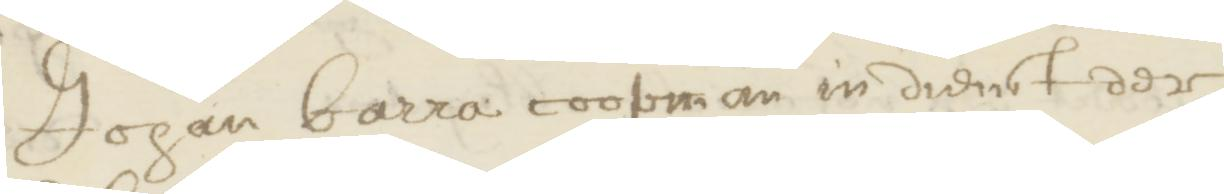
Johan barra coopman in dienst der
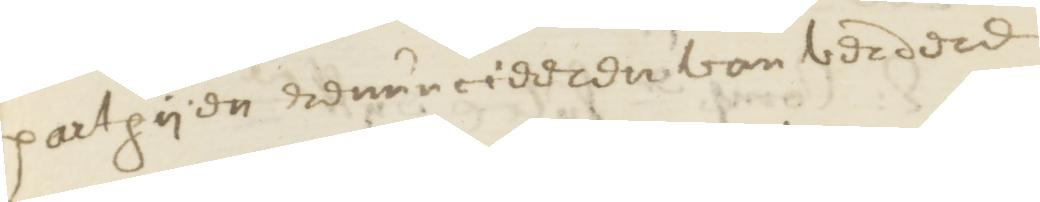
parthijen renuncieeren van verdere
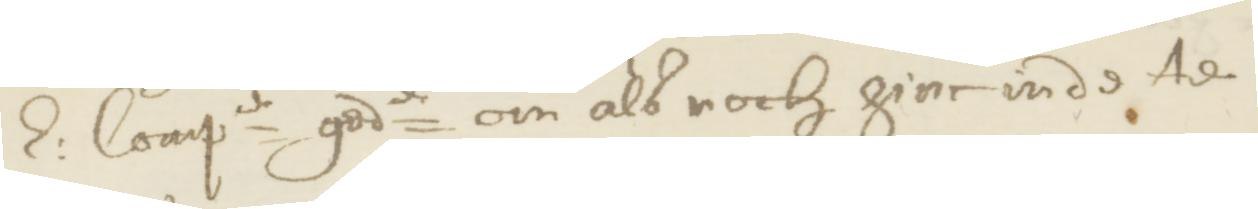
E: Comp=e ged=e om als noch hier inde te
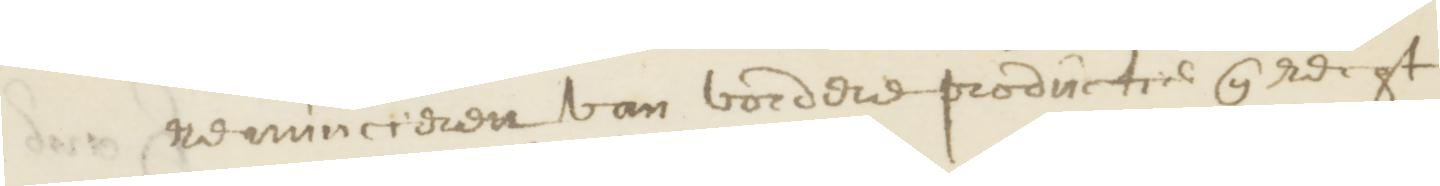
renuncieren van vordere productie ende recht
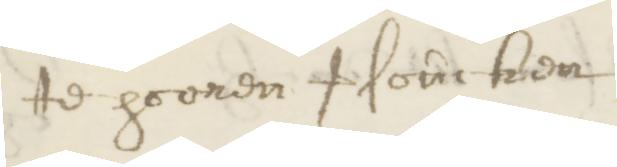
te hooren versoucken
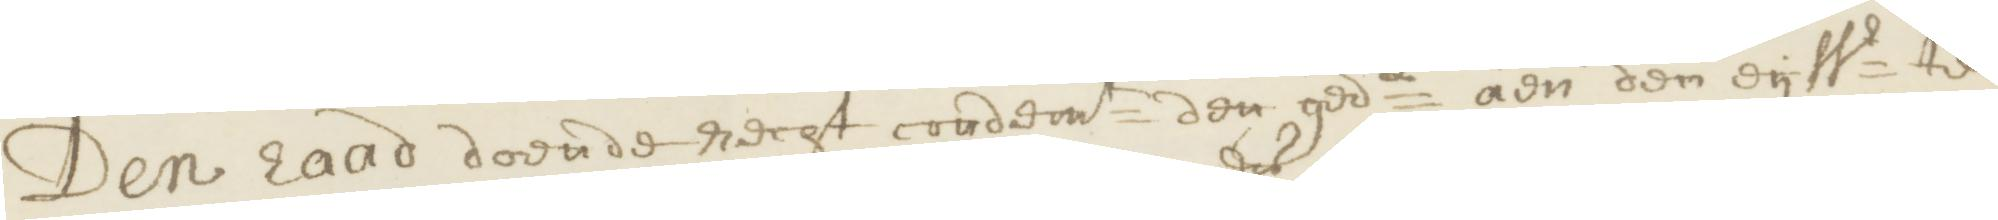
Den raad doende recht condem=t den ged=te aen den eijst=r te
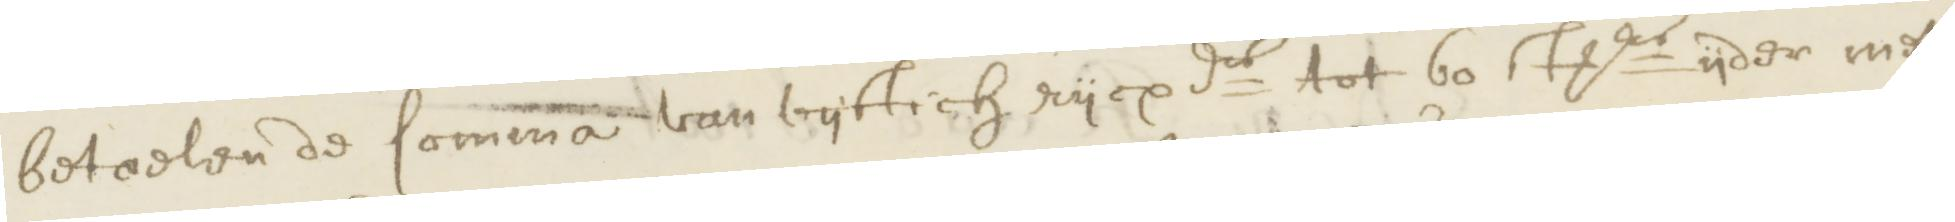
betaelen de somma van vyftich rijcx d=s tot 60 stver-s ijder met
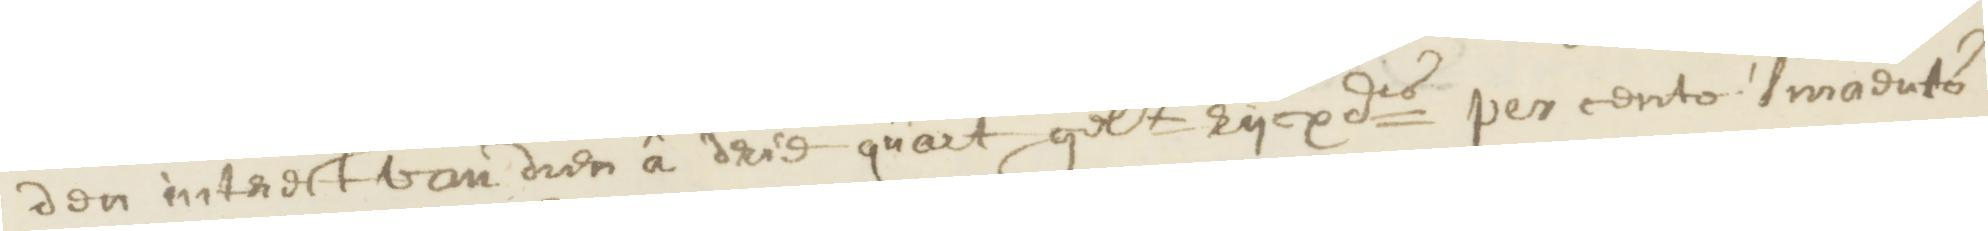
den intrest van dien â drie quart gelt rijcxd=s per cento 'smaents
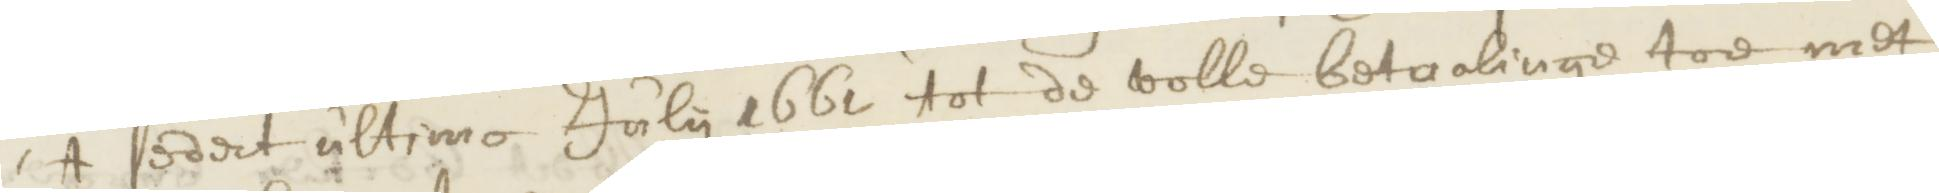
't sedert ultimo Julij 1661 tot de volle betaelinge toe met
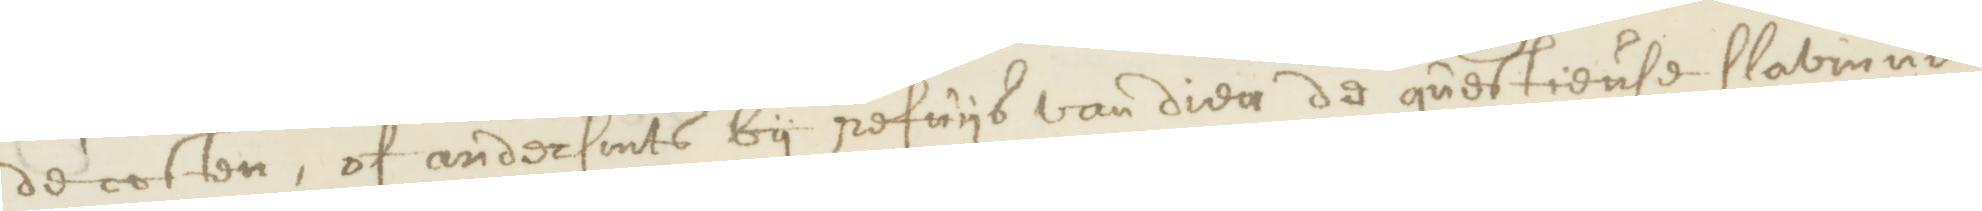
de costen, of andersints bij refuijs van dien de questieuse slavinne
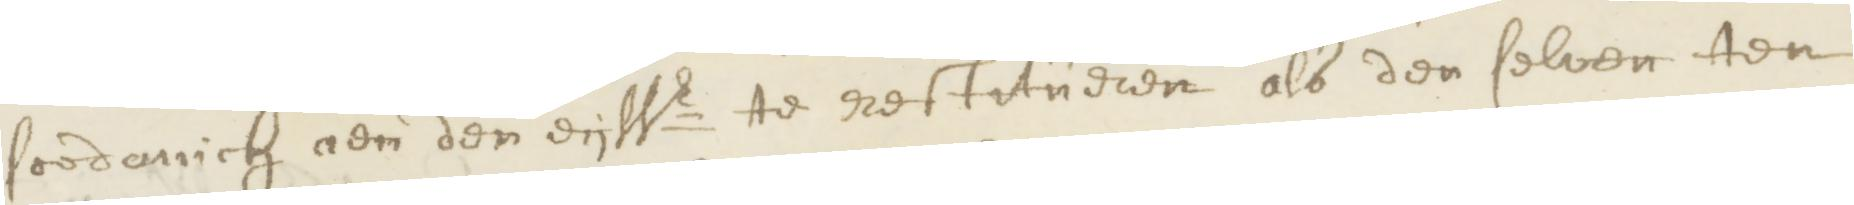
soodanich aen den eijss=r te restitueren als den selven ten
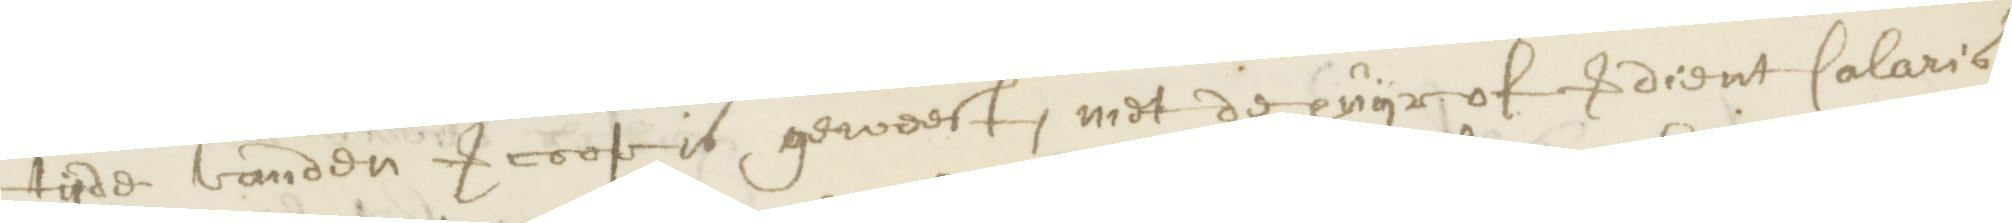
tijde van den vercoop is geweest, met de huijr of verdient salaris
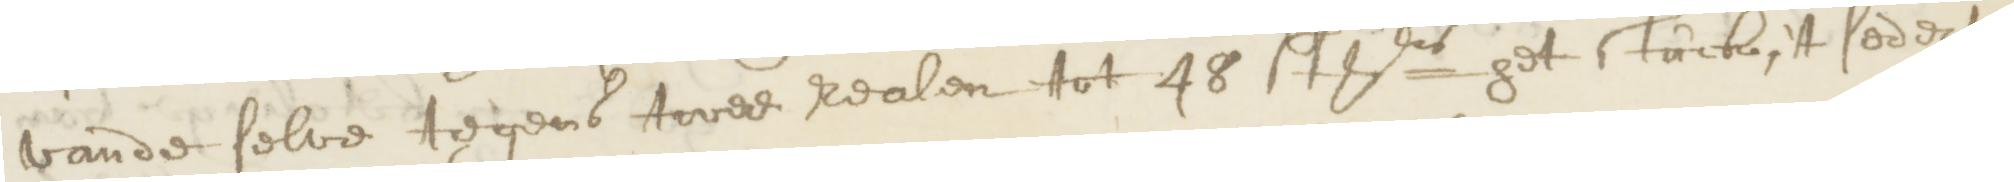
van de selve tegens twee realen tot 48 stver=s het stuck, ’t sedert
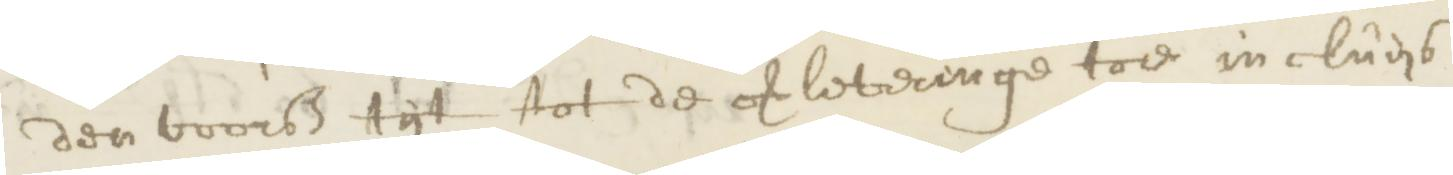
den voorsz tijt tot de overleveringe toe in cluijs
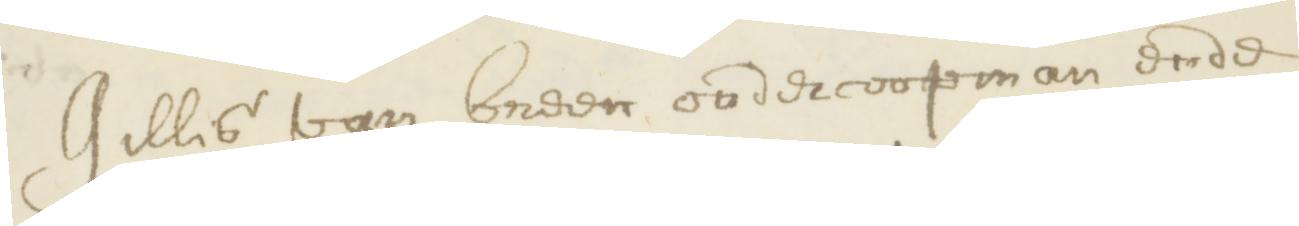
Gillis van breen ondercoopman ende
